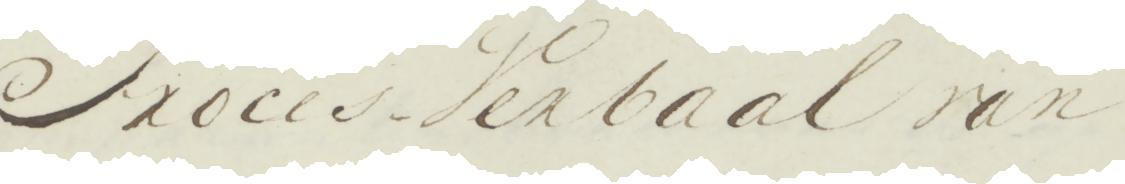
Proces-Verbaal van
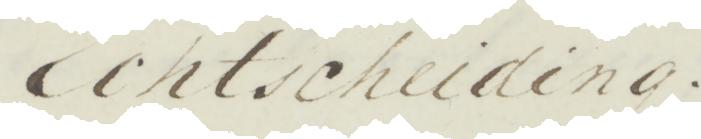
Echtscheiding.
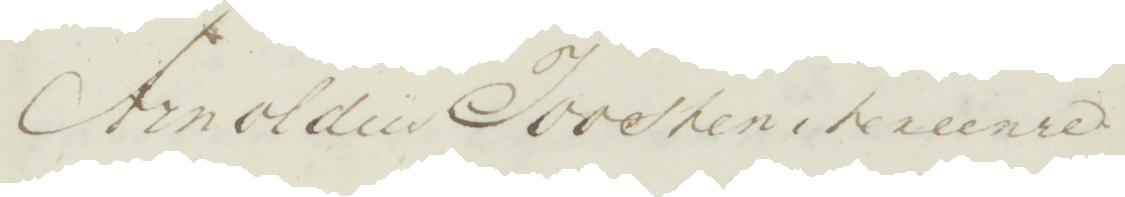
Arnoldus Ioosten, ter eenre,
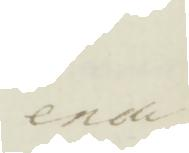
en de
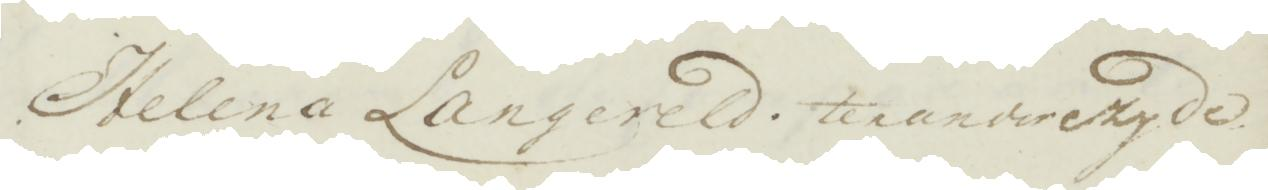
Helena Langeveld, ter andere zijde
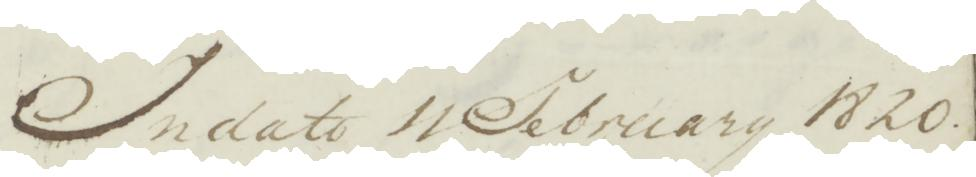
In dato 11 February 1820.
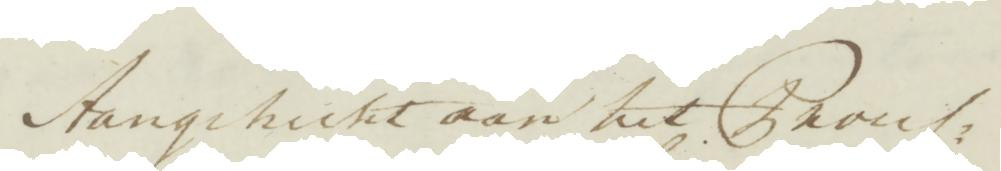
Aangehecht aan het Proces„
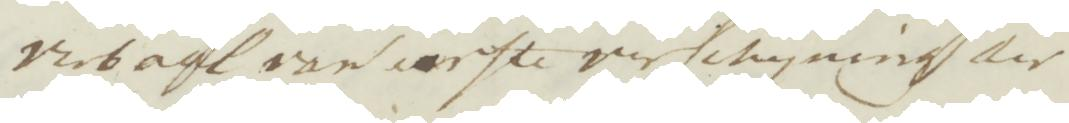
verbaal van eerste verschyning der
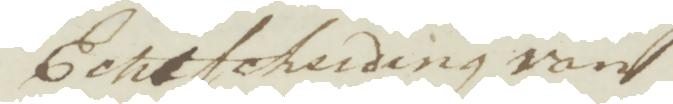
Echtscheiding van
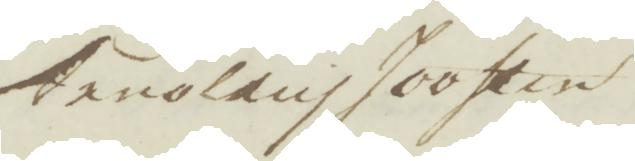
Arnoldus Joosten
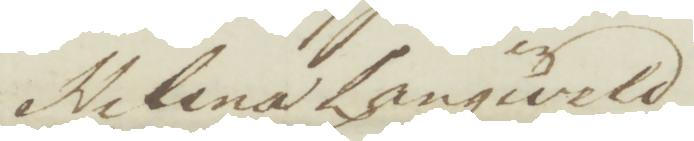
Helena Langeveld
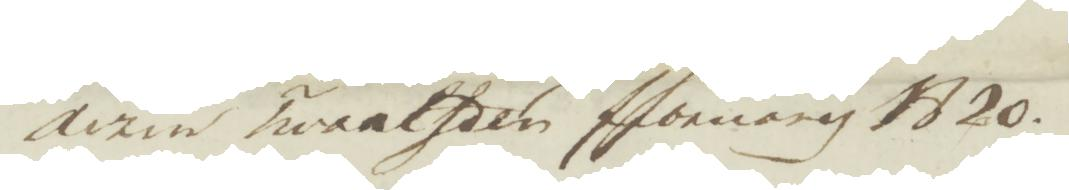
dezen Twaalfden february 1820.
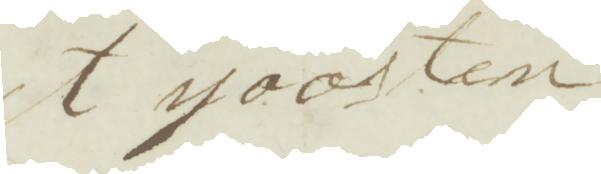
A yoosten
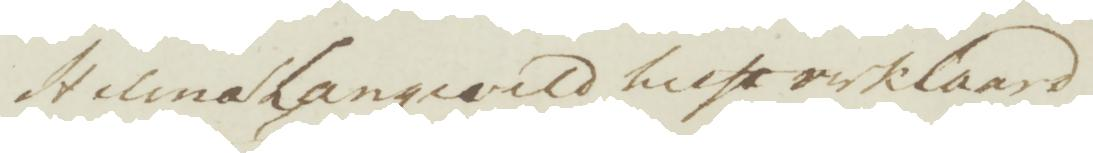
Helena Langeveld heeft verklaard
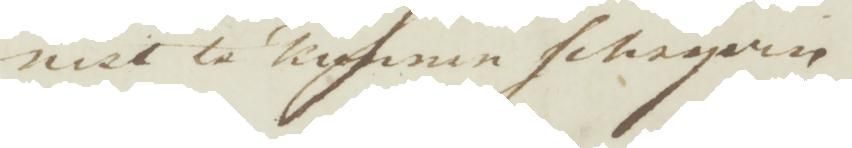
niet te kunnen schryven
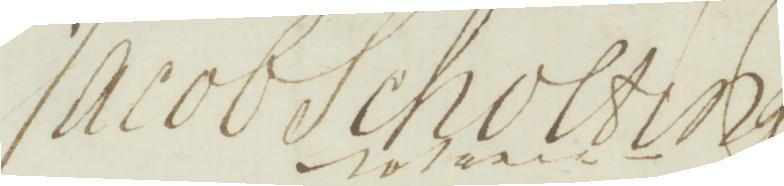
Jacob Scholting notaris
